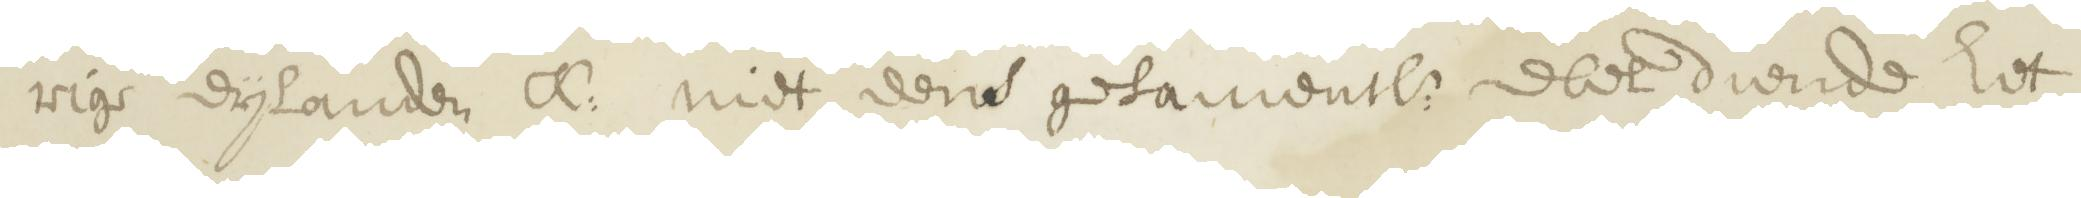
rige eijlanden &: niet eens gesamentlijk wel diende het
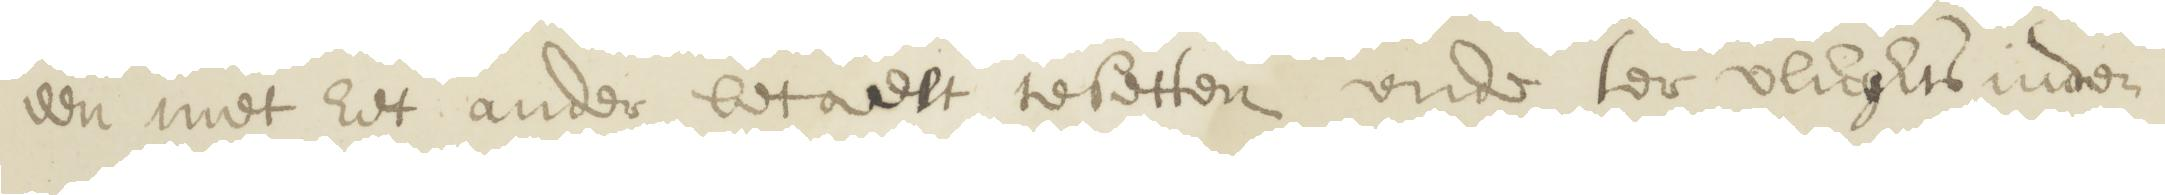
een met het ander betaelt te setten ende ter vlughts inden
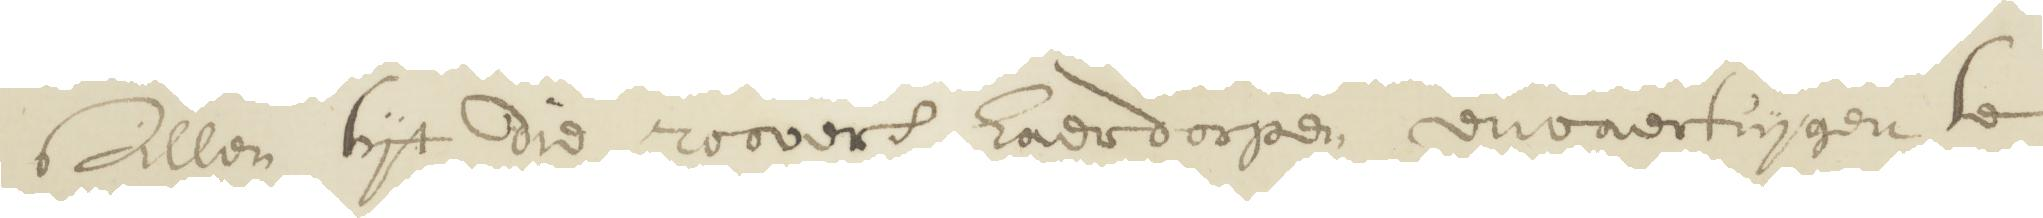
stillen tijt die roovers haer dorpen envaertuijgen te
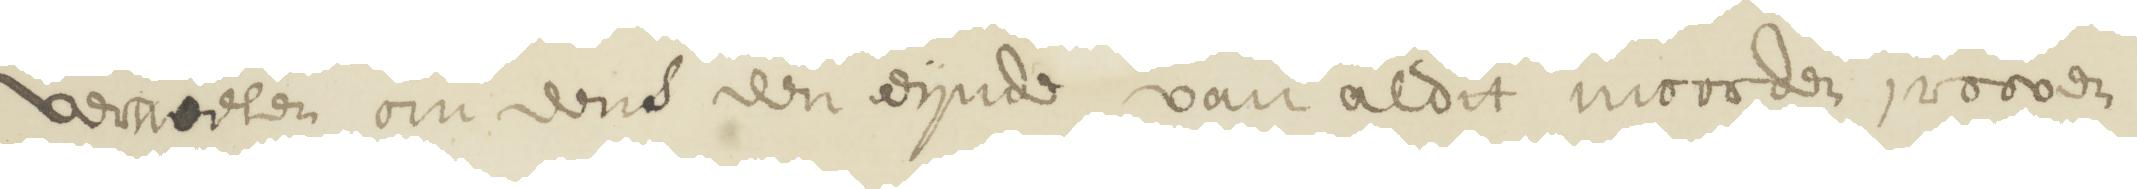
vernielen om eens een eijnde van aldit moorden, rooven
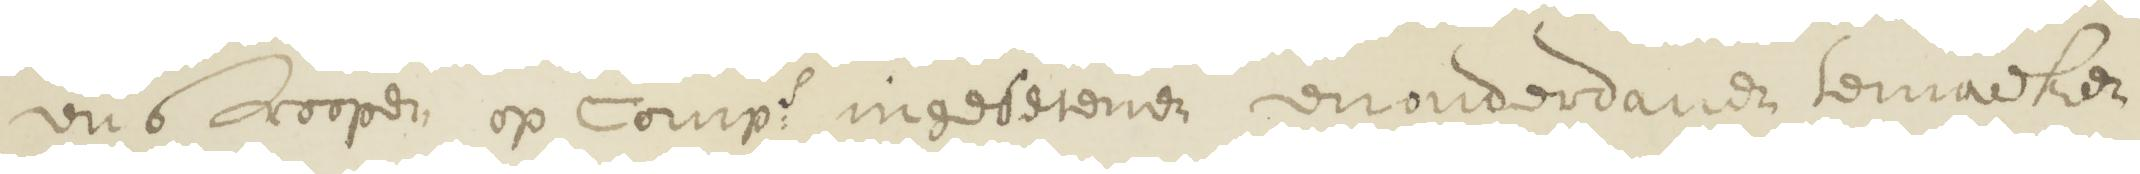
en stroopen op Comp:s ingesetenen en onderdanen temaeken
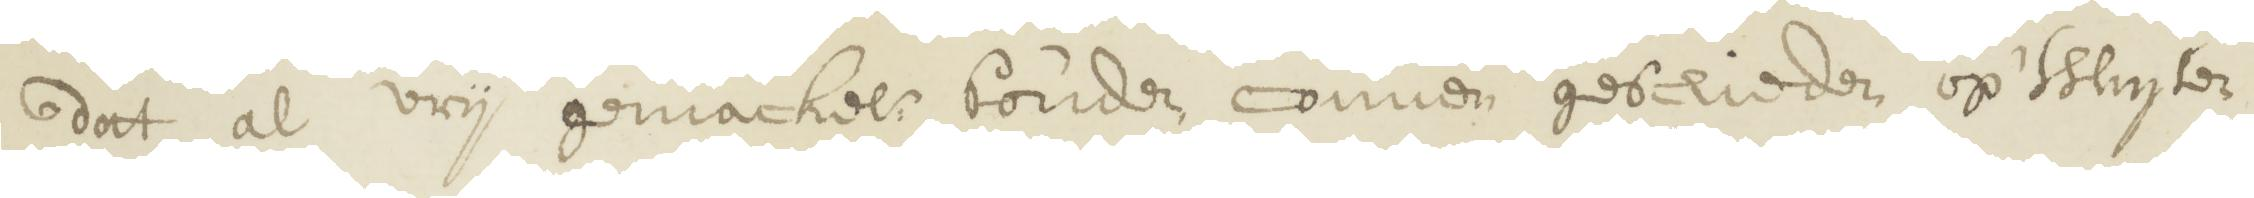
dat al vrij gemackelijk souden connen geschieden op 'tsluyten
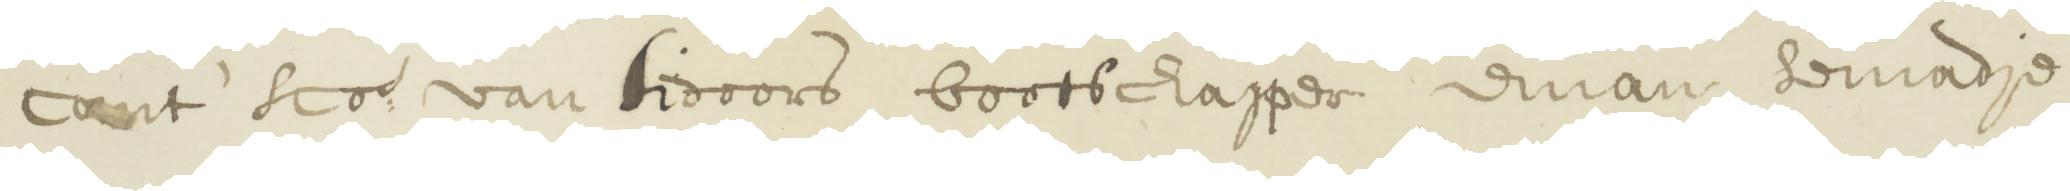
cant 'sco:s van tidoors bootschapper eman semadje
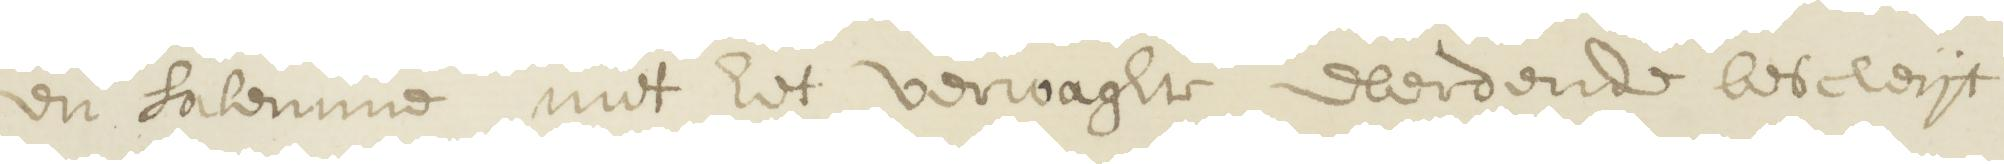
en salemme met het verwaghte werdende bescheijt
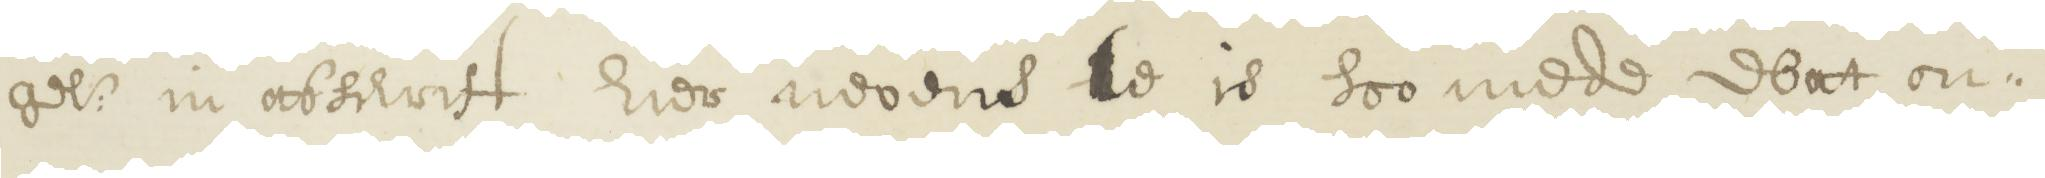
gelijk in afschrift hier nevens te is soo mede wat on„
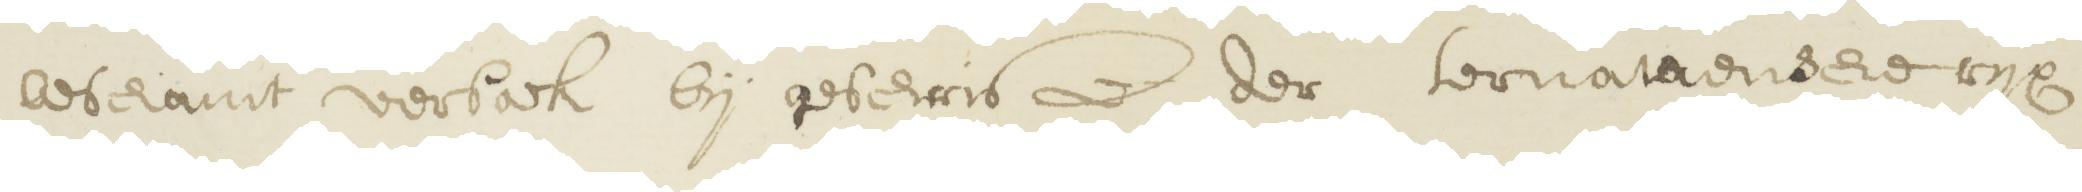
beschamt versoek bij geschrist der ternataensche rijx
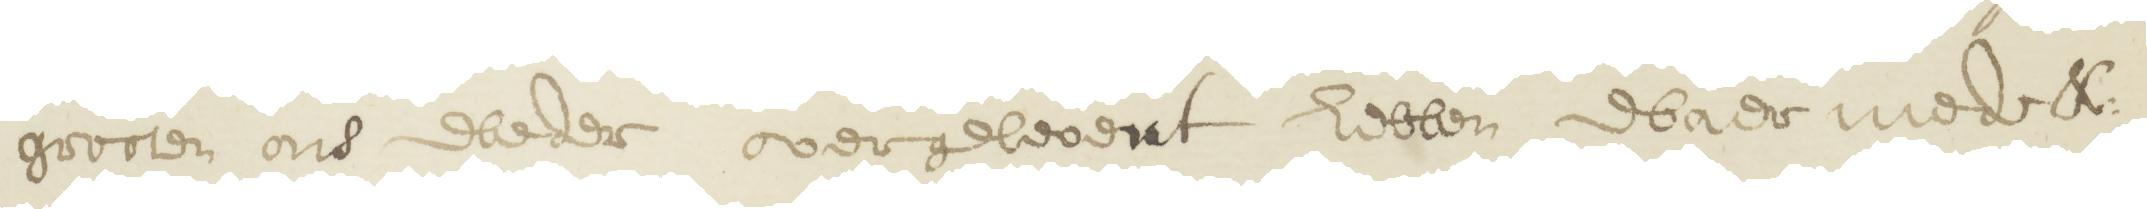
grooten ons weder overgelevert hebben waer mede &:
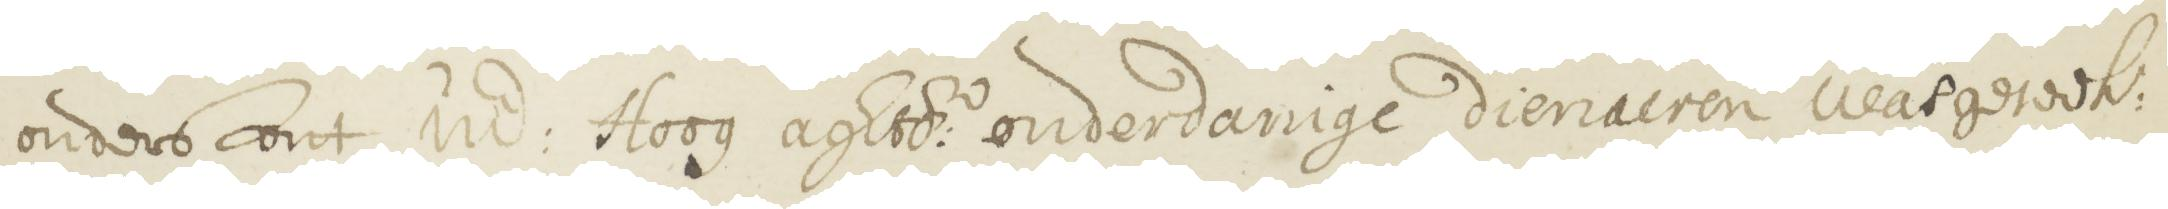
onderstont UE: Hoog aghtb:e onderdanige dienaeren was geteek:
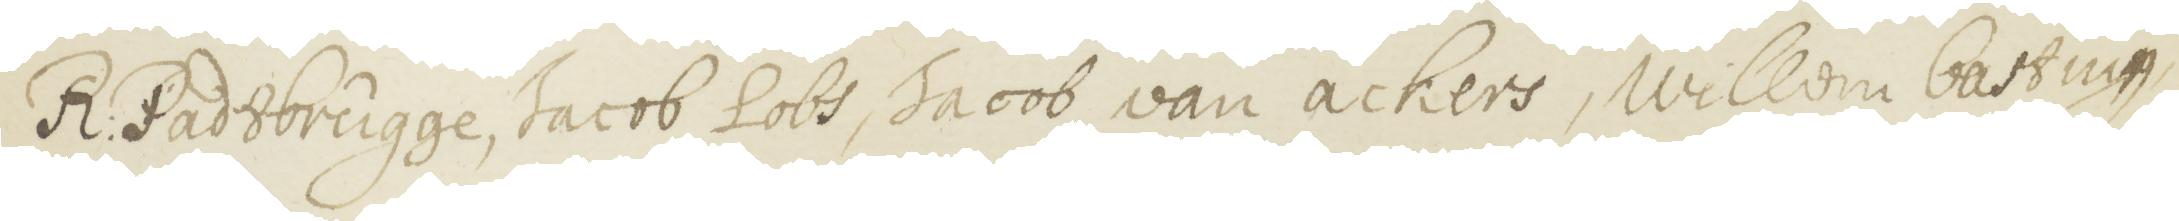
R: Padsbrugge, Iacob Lobs, Iacob van ackers, willem basting,
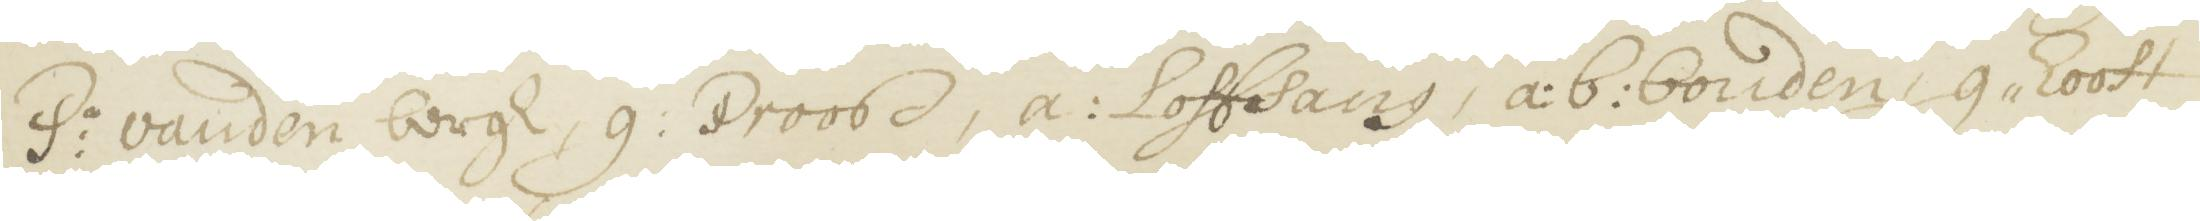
P:o van den bergh, g: Proost, a: loffsang, a: b: bouden, g„ hooft
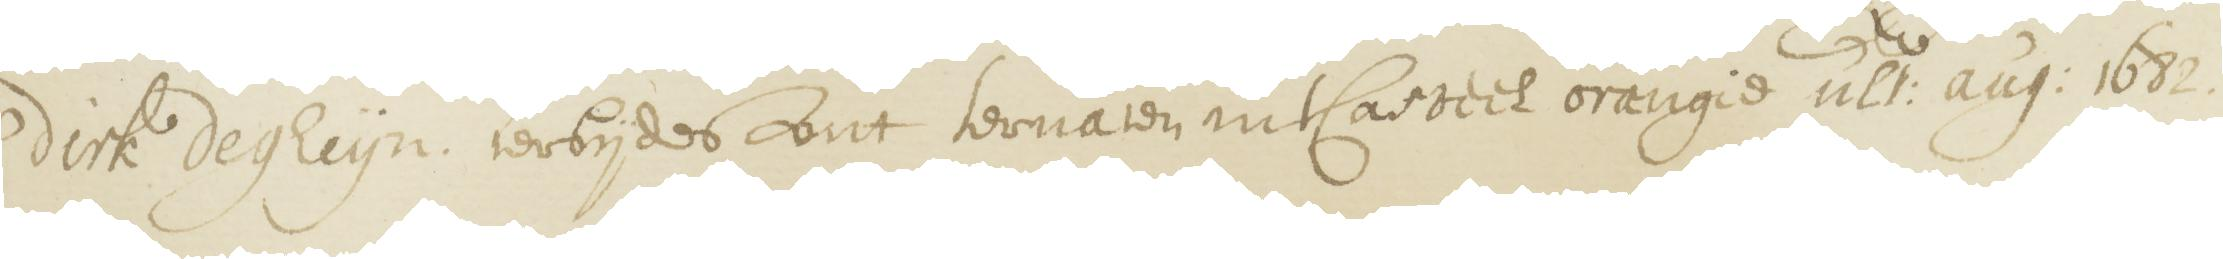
dirk de gheijn. terbijdestont ternaten in't Casteel orangie ult:o aug: 1682.
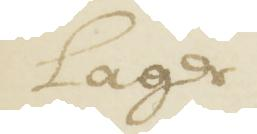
Lager
